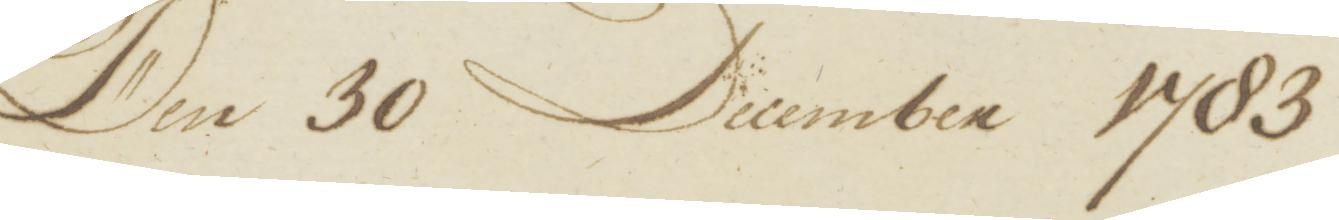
Den 30 December 1783
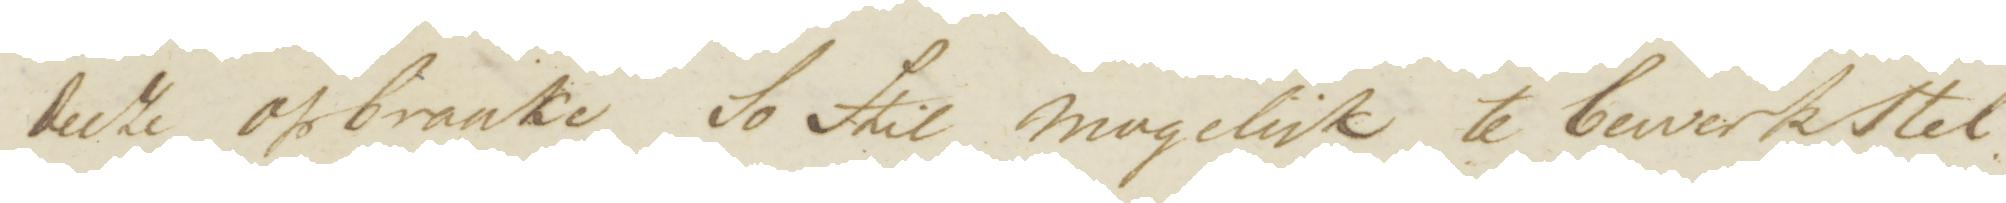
deeze opbraake so stil mogelijk te bewerkstel
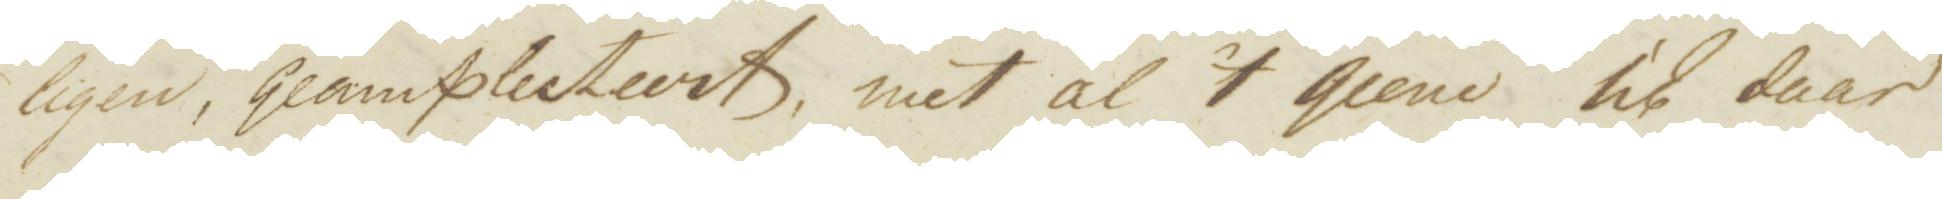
ligen, geamplecteert, met al ’t geene uE daar
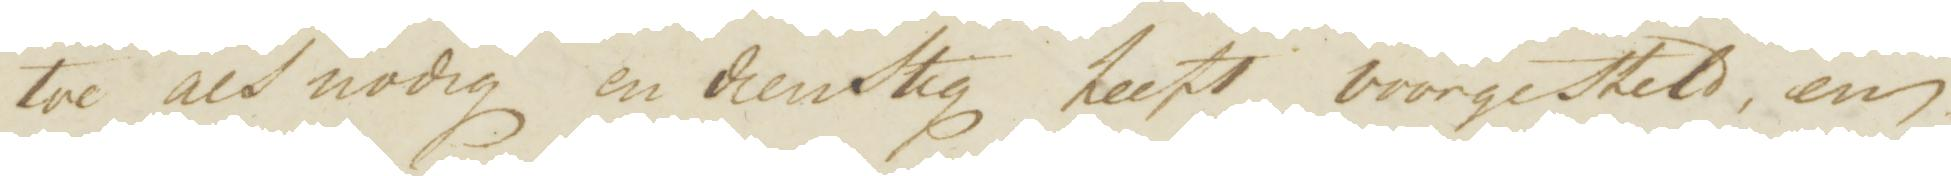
toe als nodig en dienstig heeft voorgesteld, en
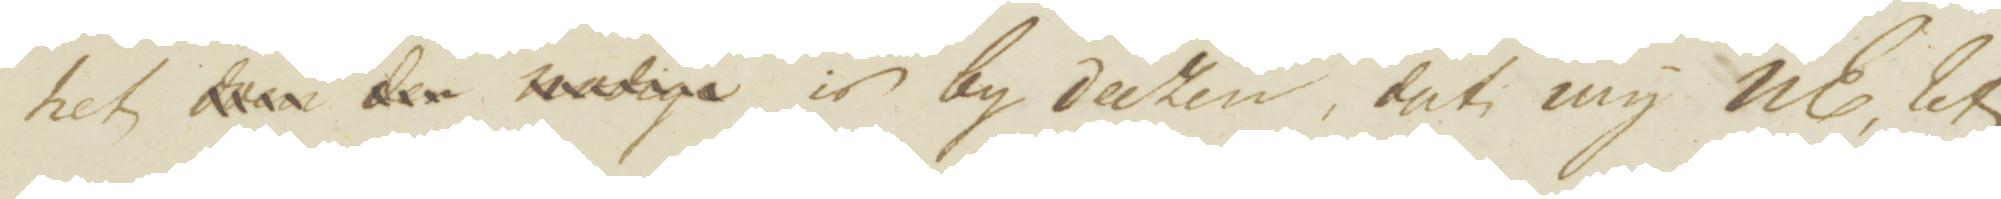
het doen der nodige is by deezen , dat wij uE, het
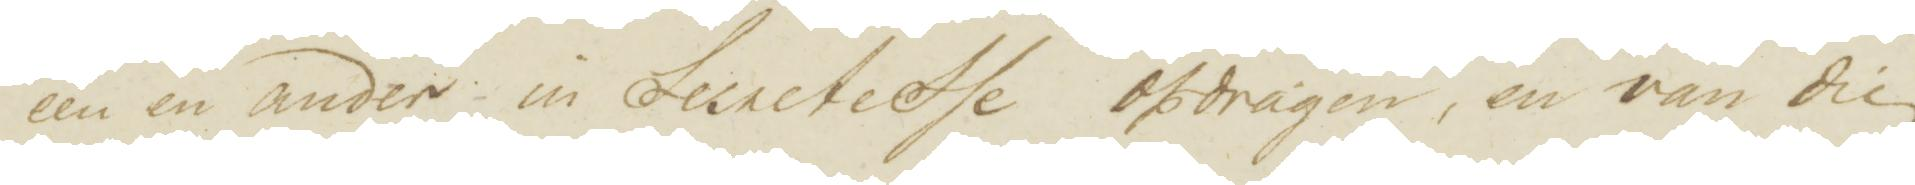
een en ander in secretesse opdragen, en van dien
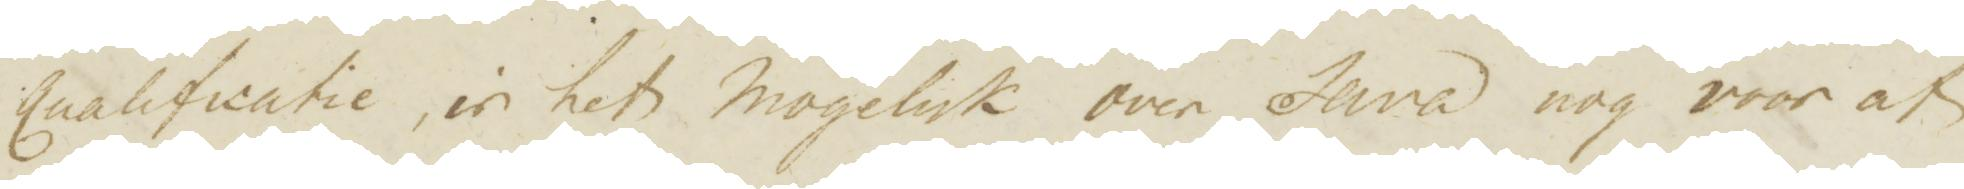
qualificatie , is het mogelyk over Java nog voor af
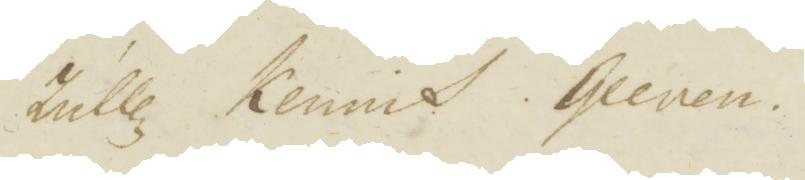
zullen kennis geeven.
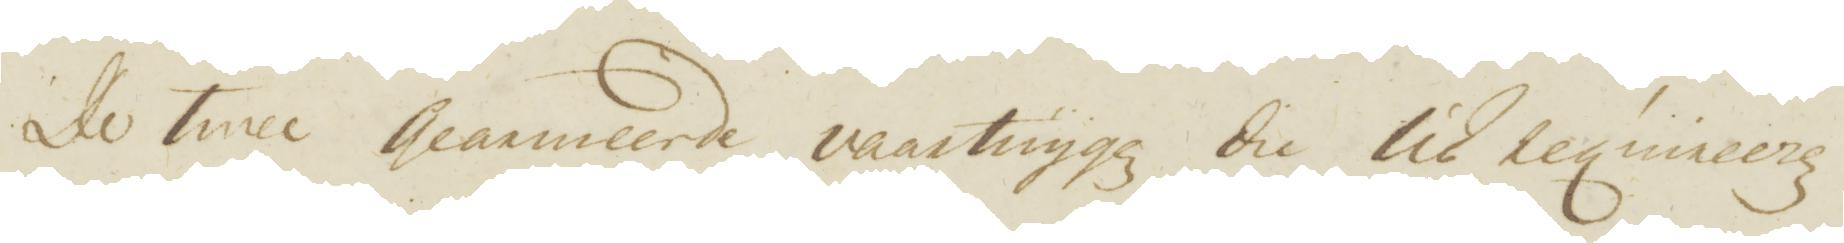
De twee gearmeerde vaartuijgen die uE requireeren
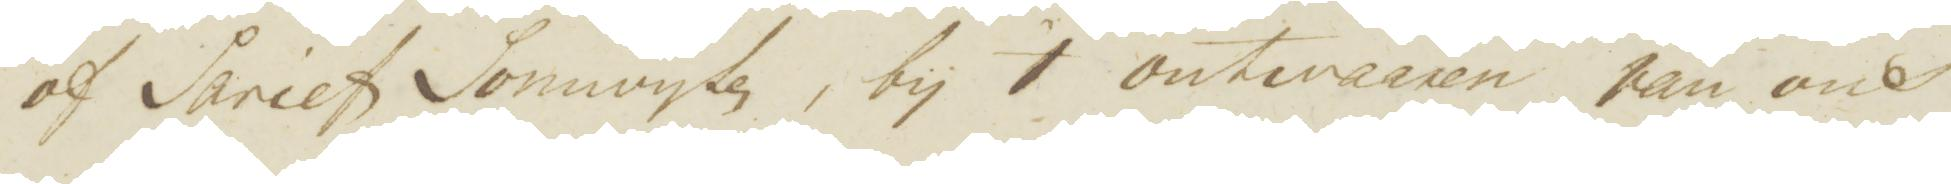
of Sarief Somwylen , bij 't ontwaaren van ons
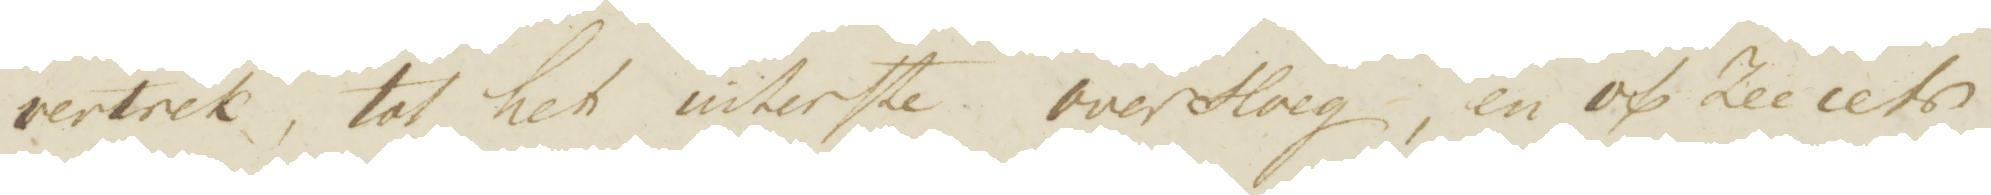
vertrek, tot het uiterste oversloeg, en op zee iets
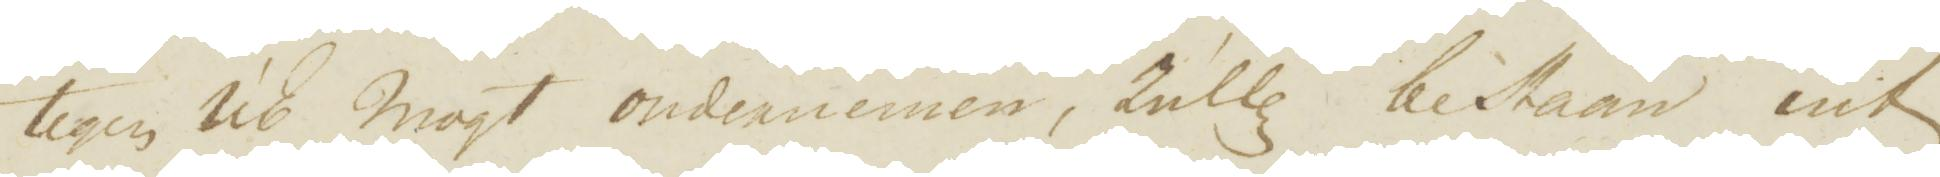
tegen uE mogt ondernemen, zullen bestaan uit
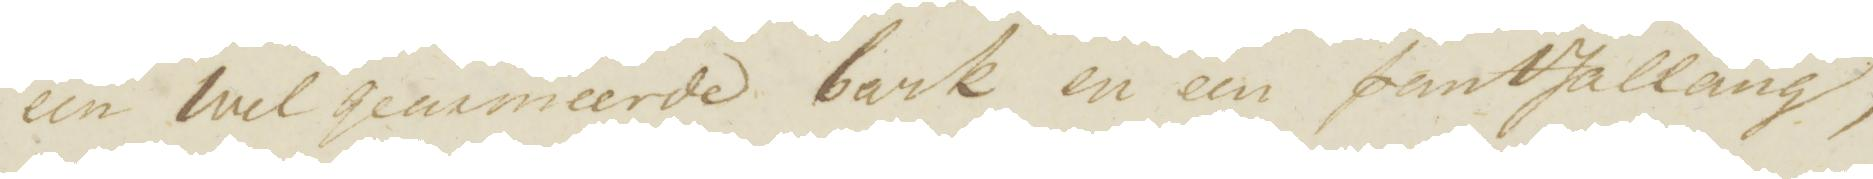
een wel gearmeerde bark en een pantjallang,
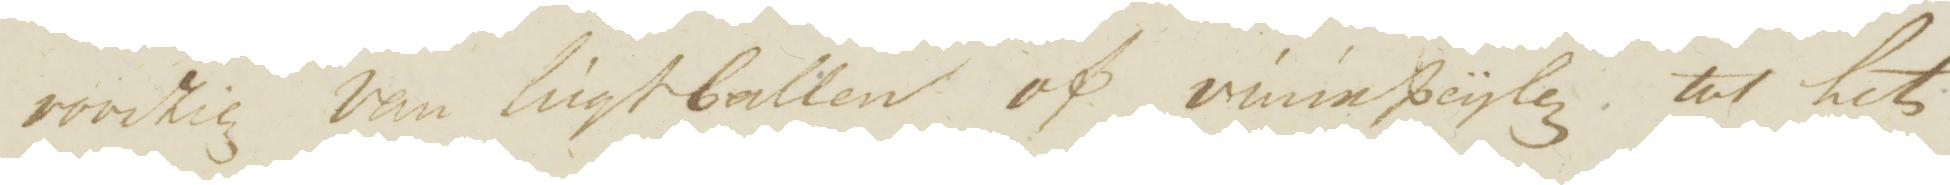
voorzien van lugtballen of vuurpeijlen tot het
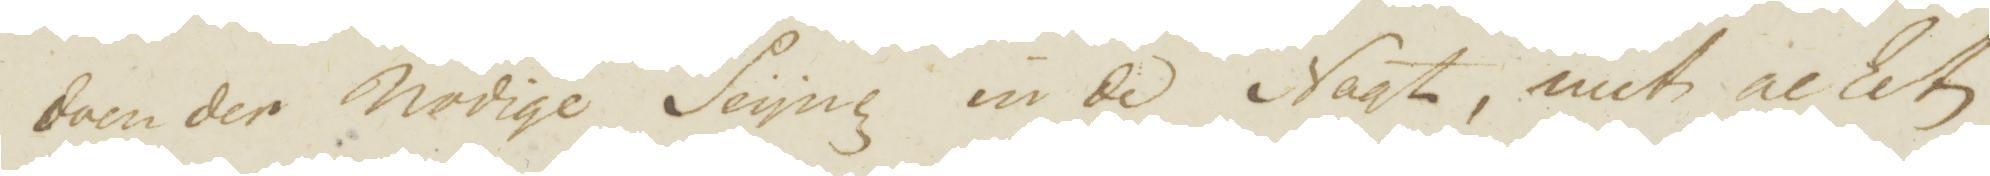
doen der nodige seijnen in de Nagt, met al het
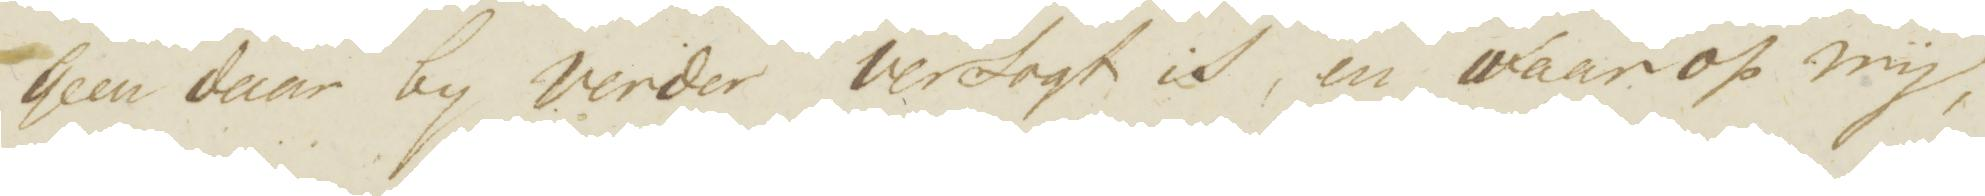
geen daar by verder versogt is, en waar op wij,
